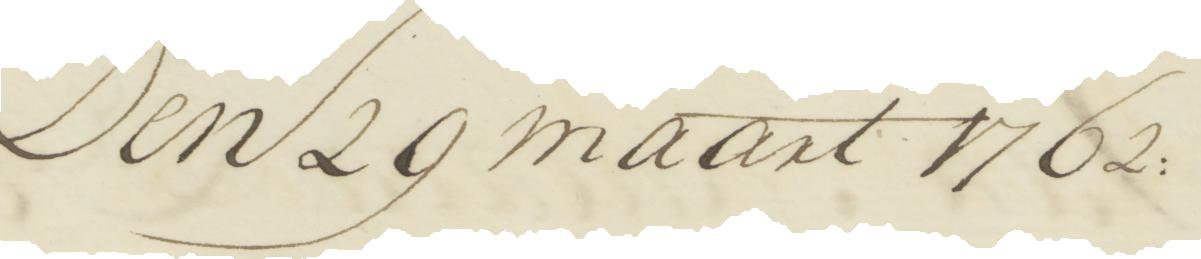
Van Malacca Den 29 maart 1762:
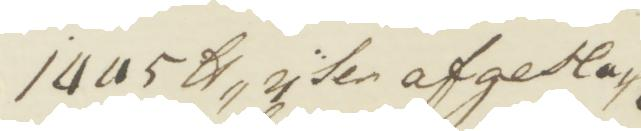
1445 lb „ ijser afgesla
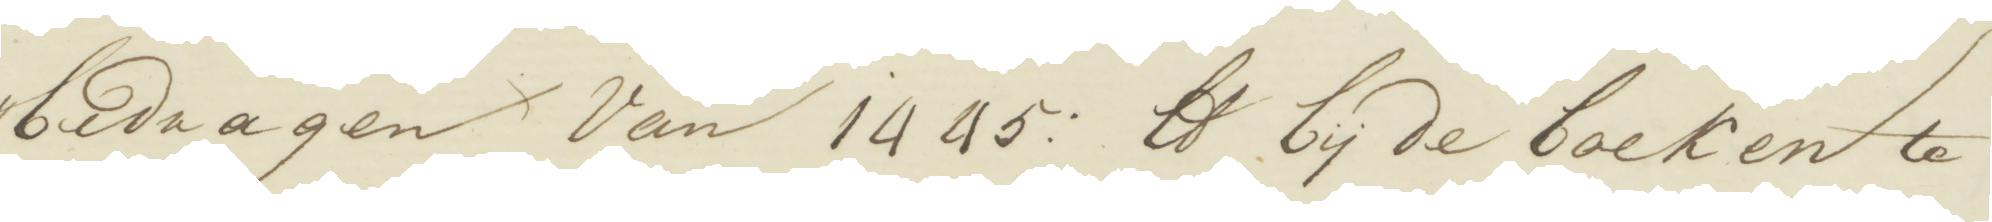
bedragen van 1445: lb bij de boeken te
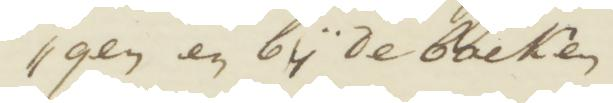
„gen en bij de boeken
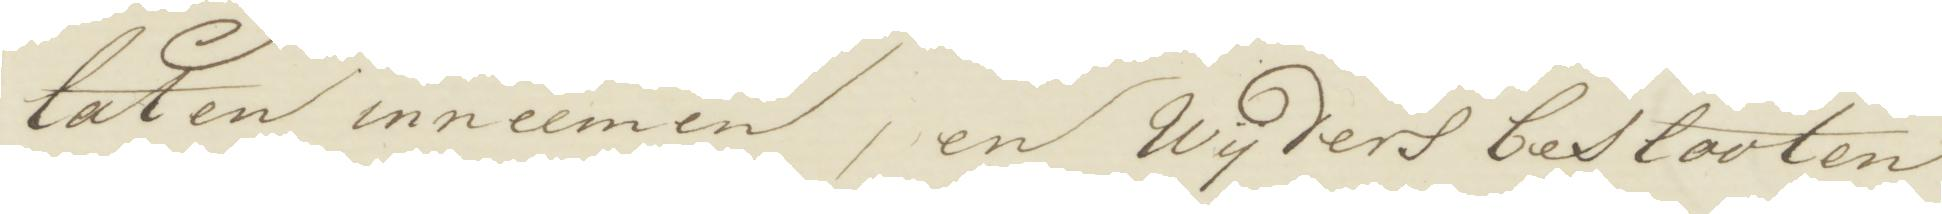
laten inneemen, en wijders beslooten
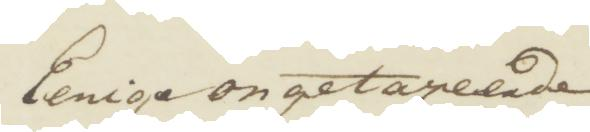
Eenige ongetaxeerde
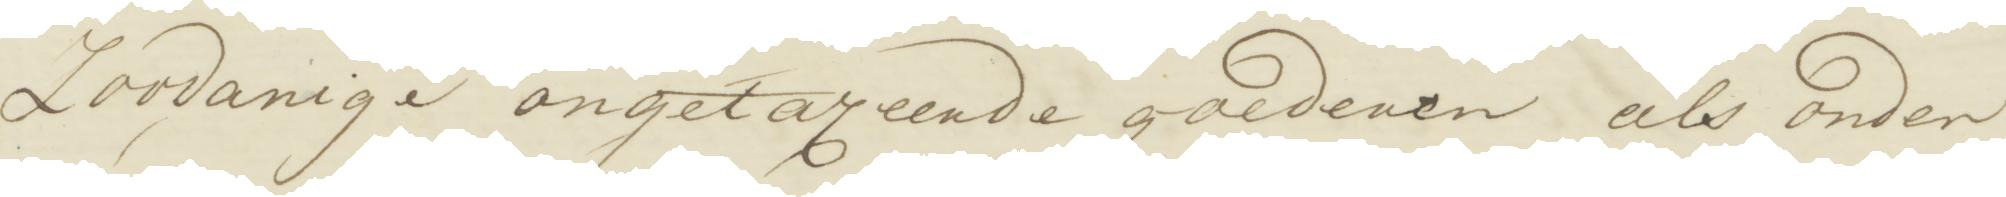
zoodanige ongetaxeerde goederen als onder
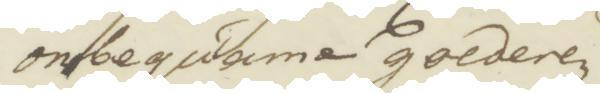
onbequame goederen
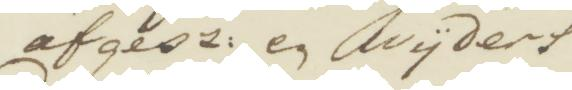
afgesz: en wijders
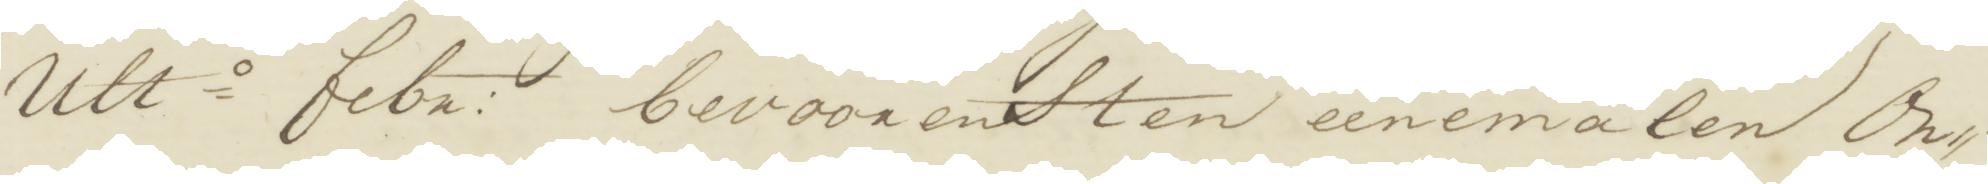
Ult=o febr: bevoorens ten eenemalen On„
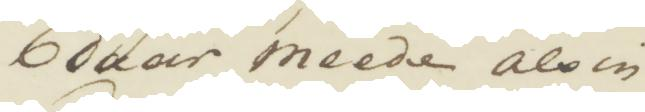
daar meede als in
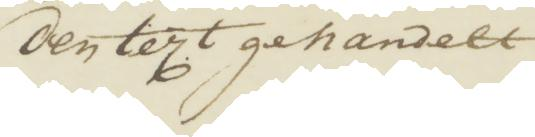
den text gehandelt
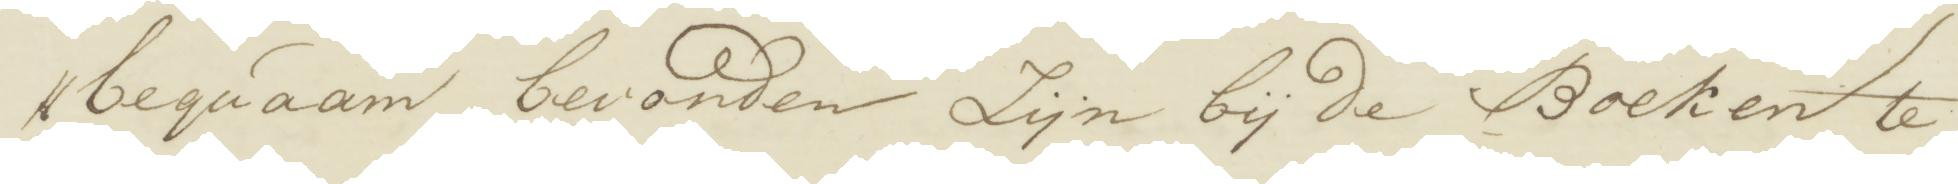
„bequaam bevonden Zijn bij de Boeken te
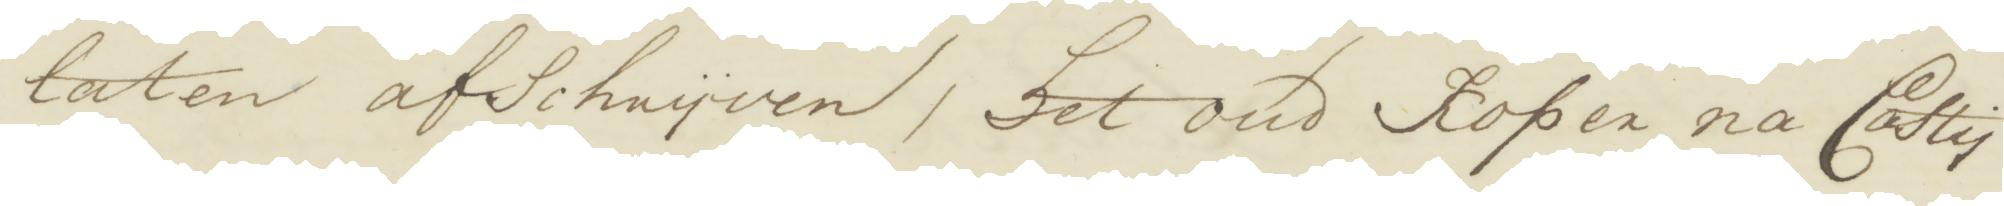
laten afschrijven, het oud Koper na Castij
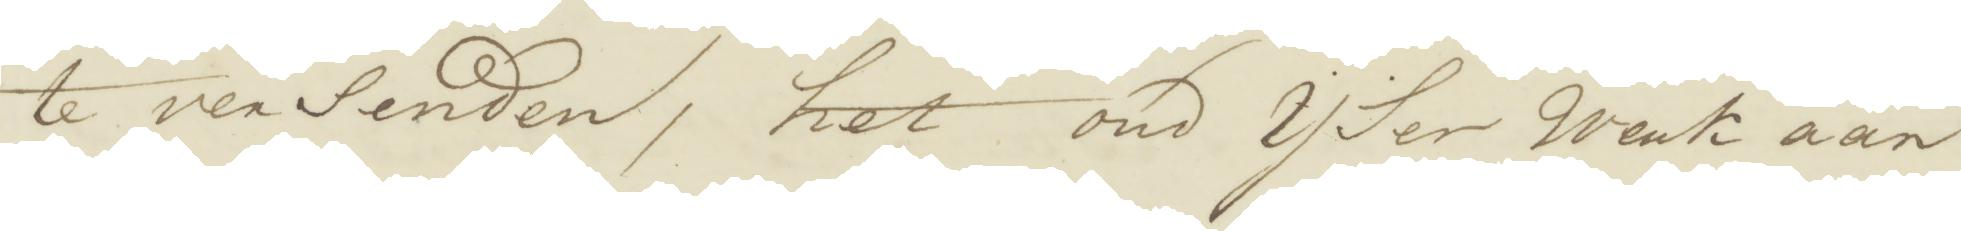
te versenden, het oud ijser werk aan
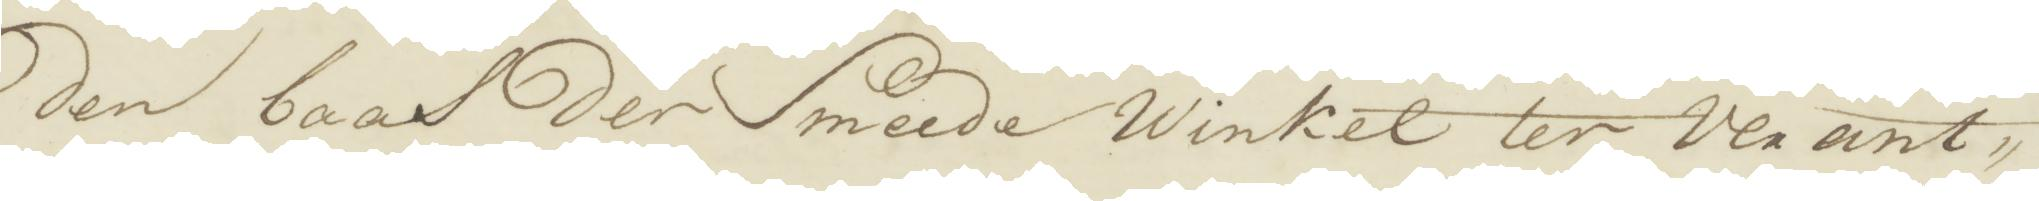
den baas der Smeede winkel ter verant„
